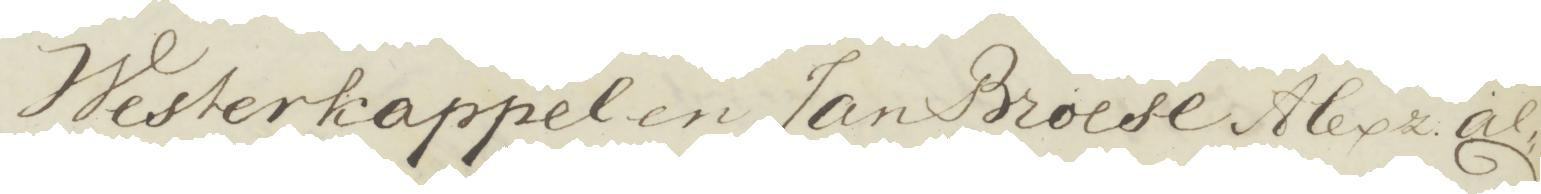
Westerkappel en Jan Broese Alexz. al
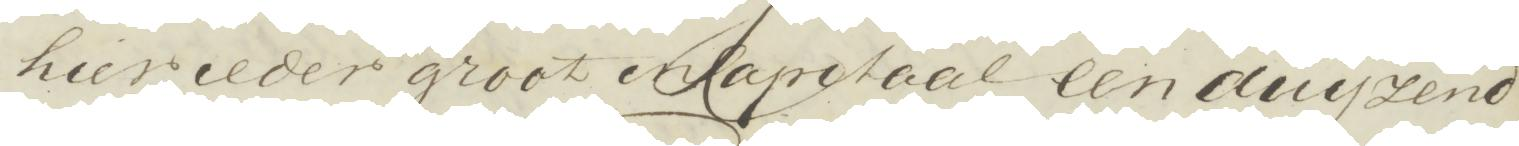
hier ieder groot in Capitaal een duyzend
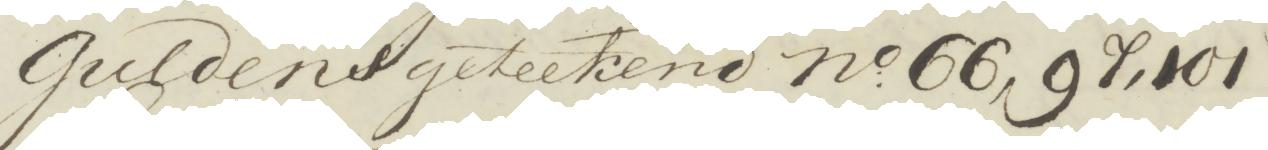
guldens geteekend n:o 66, 97, 101
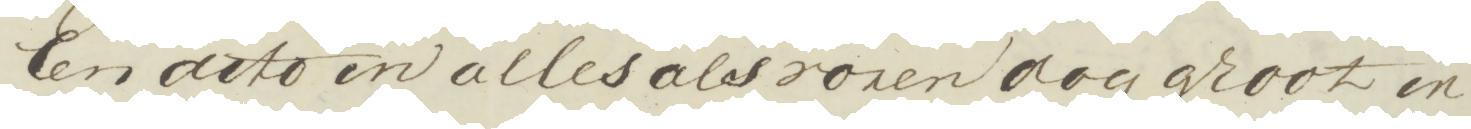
Een dito in alles als voren dog groot in
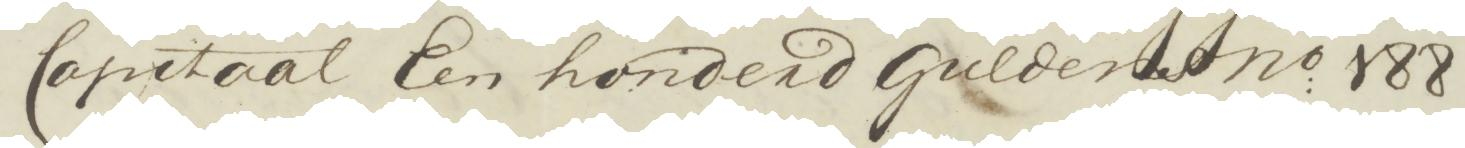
Capitaal Een honderd guldens n:o 188
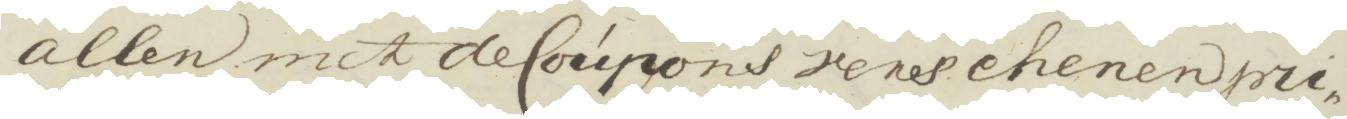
allen met de Coupons verschenen pri„
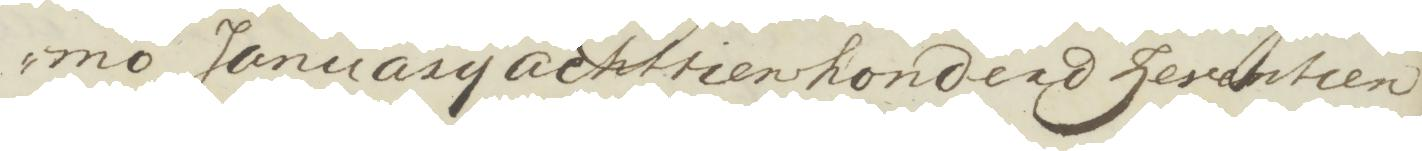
mo January achttien honderd zeventien
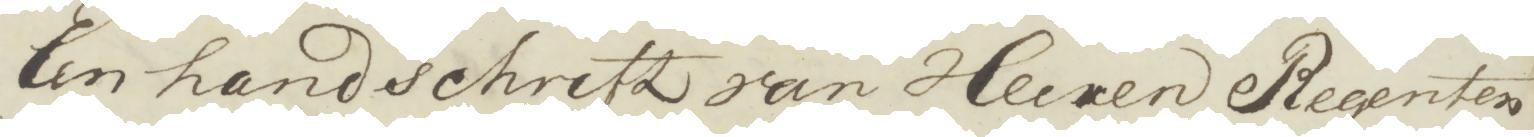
Een handschrift van Heeren Regenten
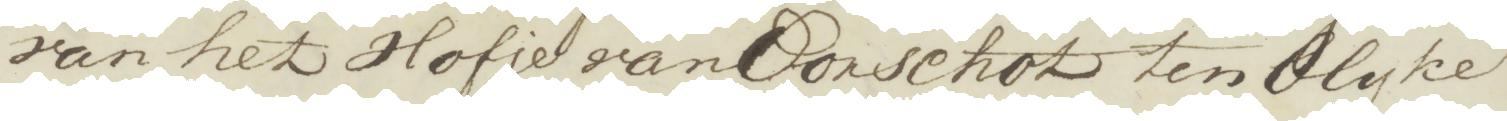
van het Hofje van Oorschot ten blyke
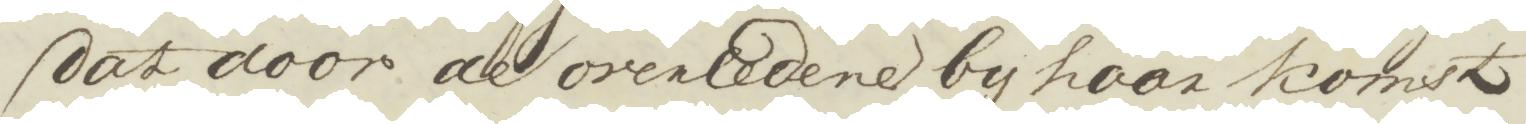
dat door de overledene by haar komst
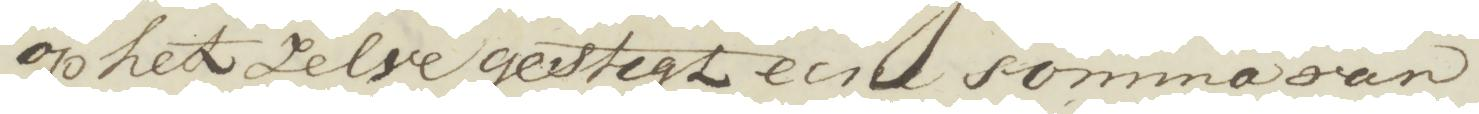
op het zelve gestigt eene somma van
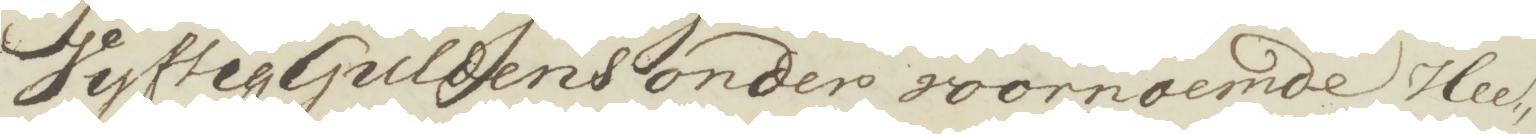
Vyftig Guldens onder voornoemde Hee
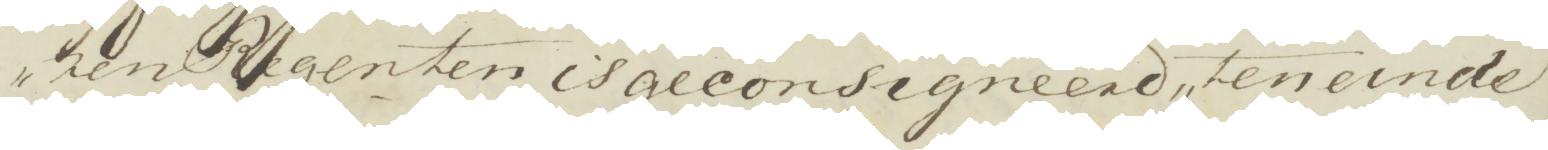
„ren Regenten is geconsigneerd, ten einde
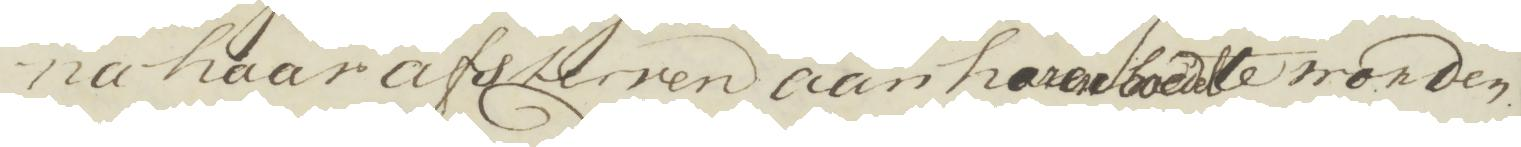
na haar afsterven aan haren bedoel te worden
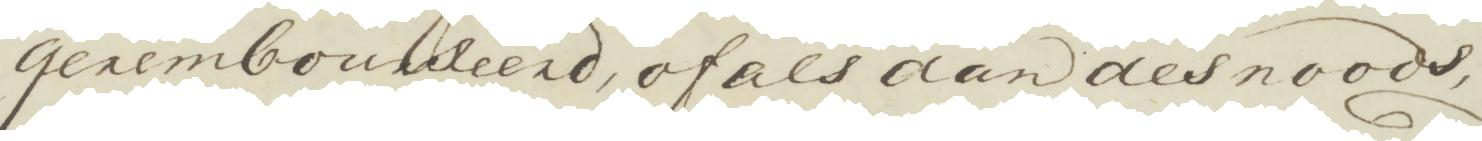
gerembouseerd, of als dan des noods,
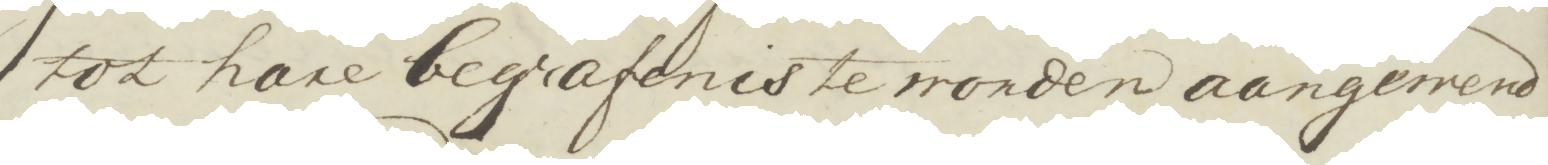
tot hare begrafenis te worden aangewend
